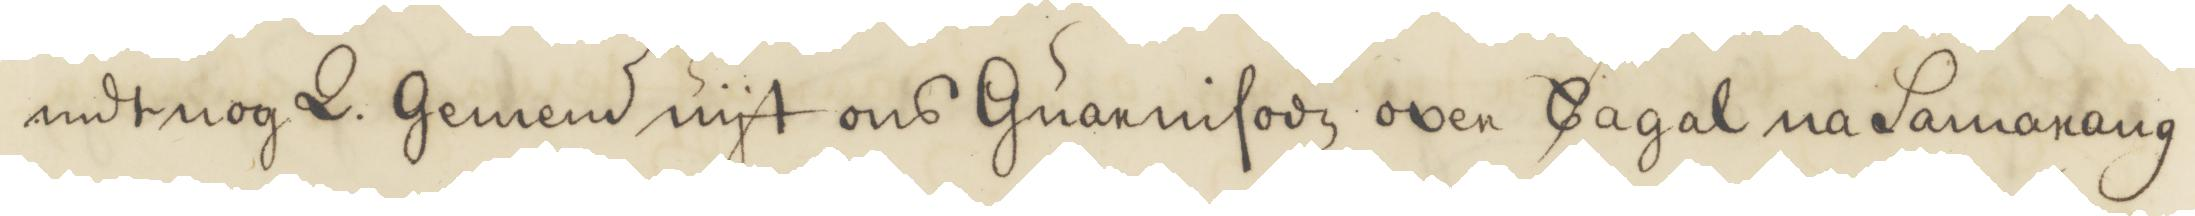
met nog 2. gemene uijt ons Guarnisoen over Tagal na Samarang
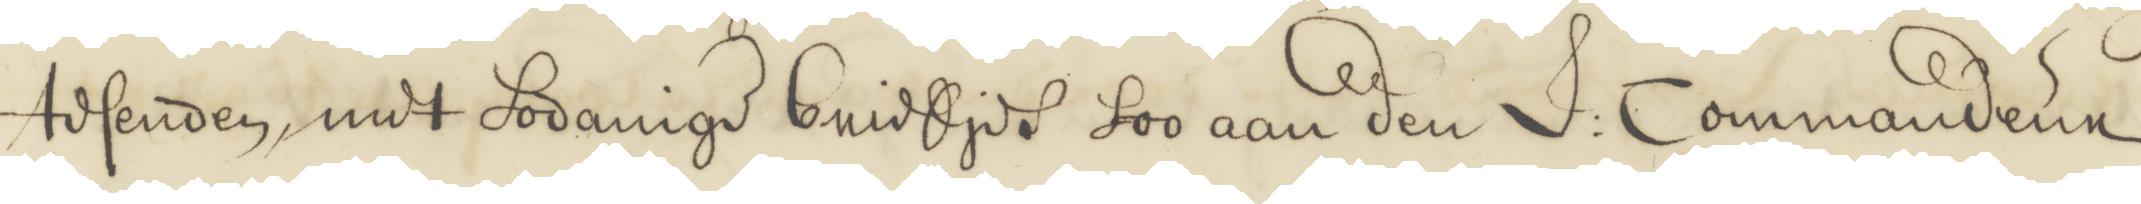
tesenden, met sodanige briefjes soo aan den E: Commandeur
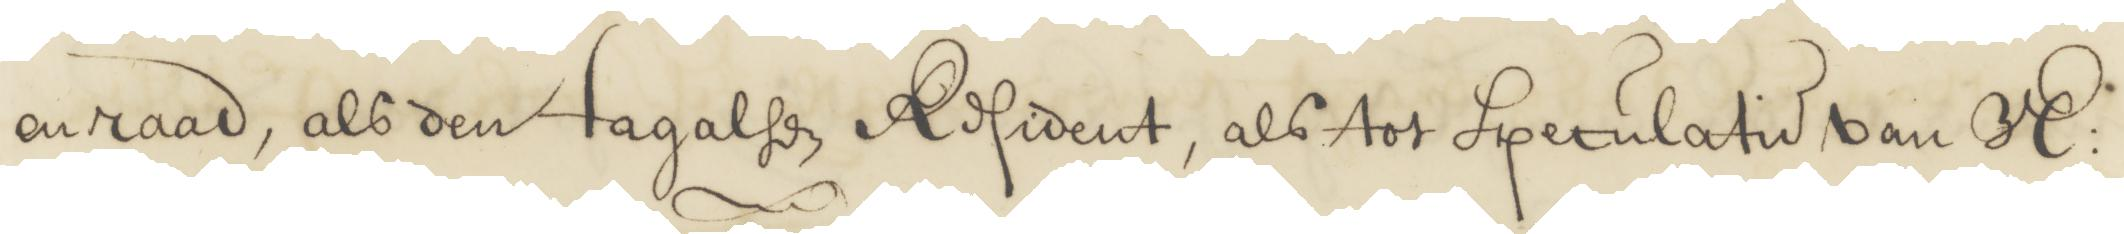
en raad, als den tagalsen Resident, als tot speculatie van UE:
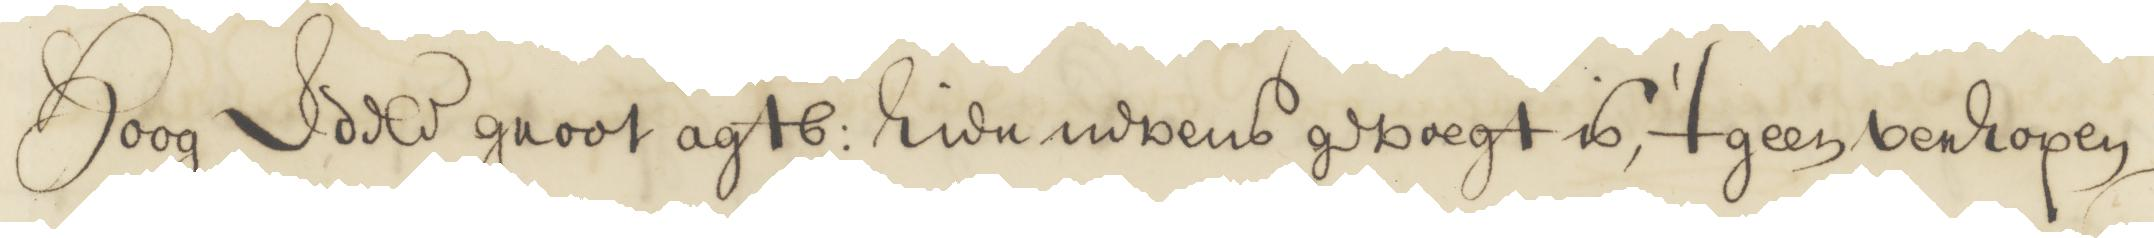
Hoog Edele groot agtb: hier nevens gevoegt is, ’t geen verhopen
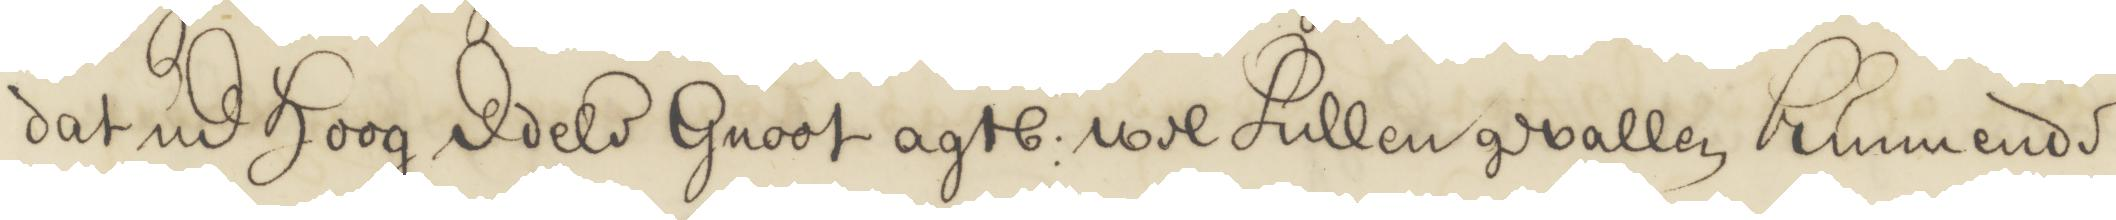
dat uE Hoog Edele Groot agtb: wel sullen gevallen kunnende
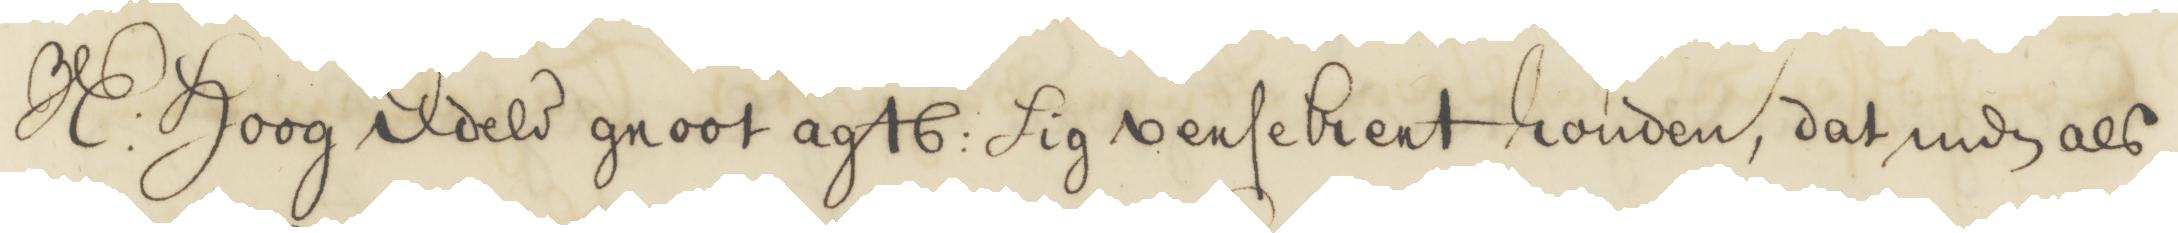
U: Hoog Edele groot agtb: sig versekert houden, dat men als
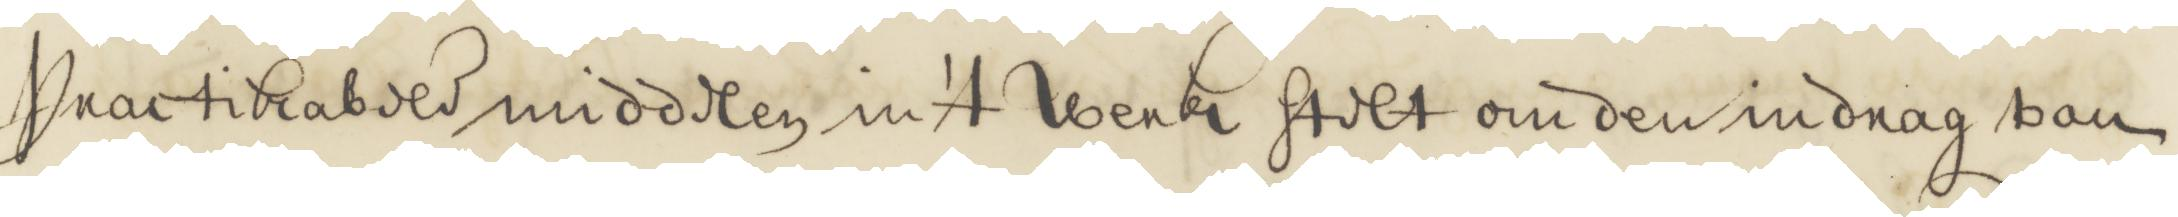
practikabele middelen in ’t werk stelt om den indrag van
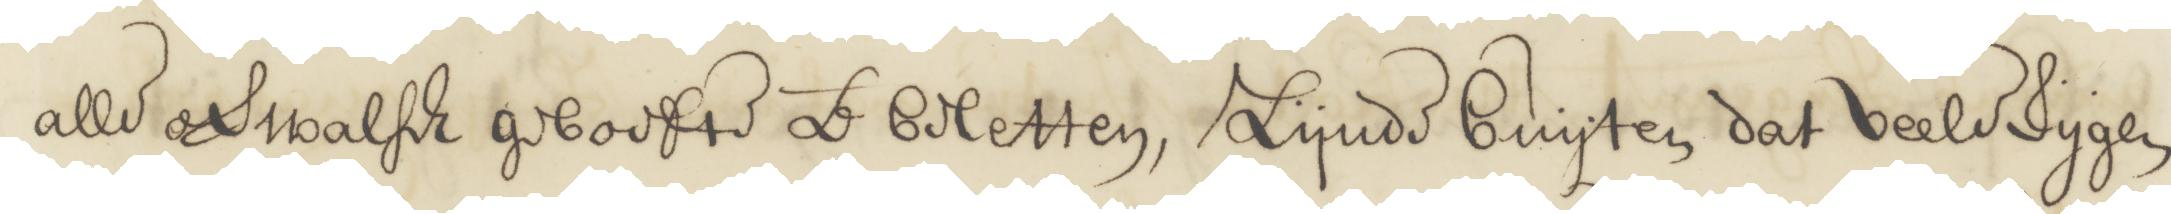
alle overwalsch geboefte te beletten, zijnde buijten dat veele eijgen
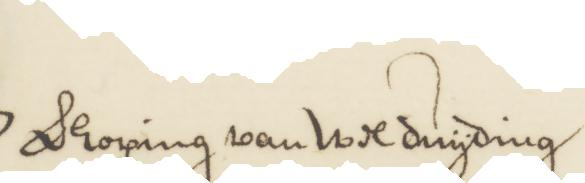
verhoping van wel duijding
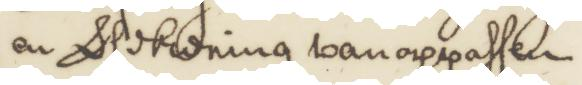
en versekering van oppassen
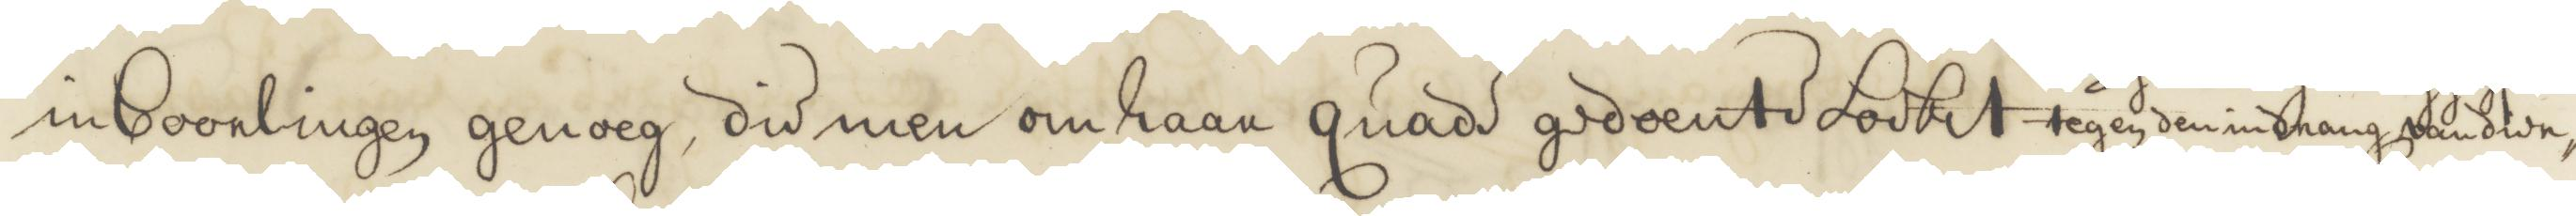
inboorlingen genoeg, die men om haar quade gedoente soekt tegen den indrang van dier„
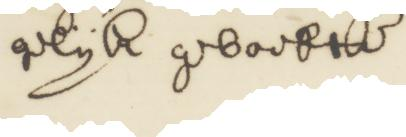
gelijk geboefte
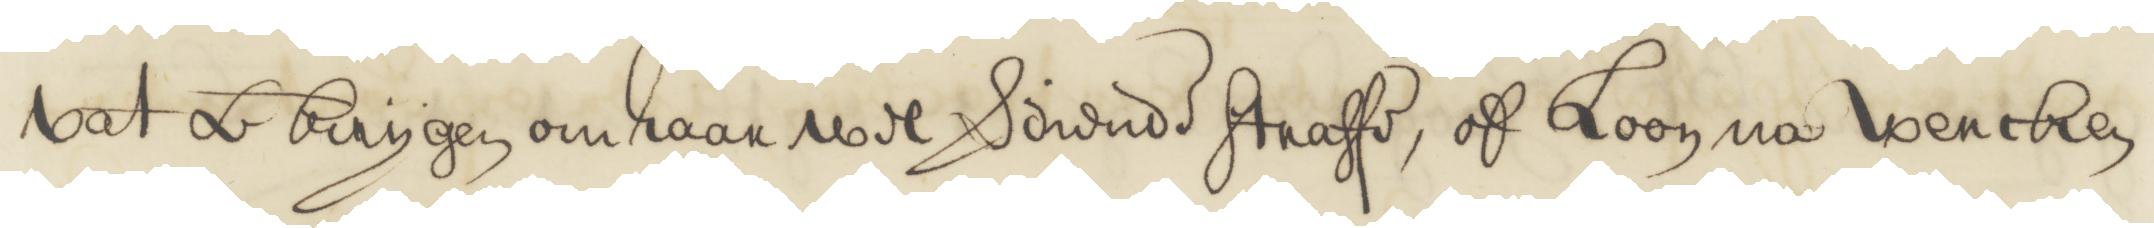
vat te krijgen om haar wel verdiende straffe, of zoon na wercken
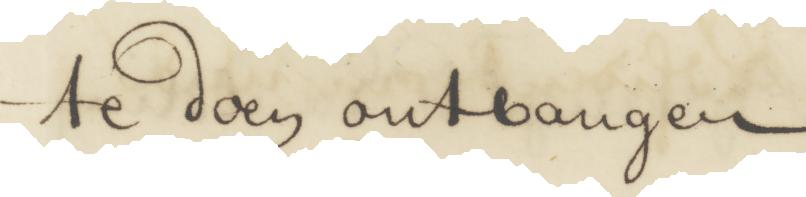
te doen ontvangen
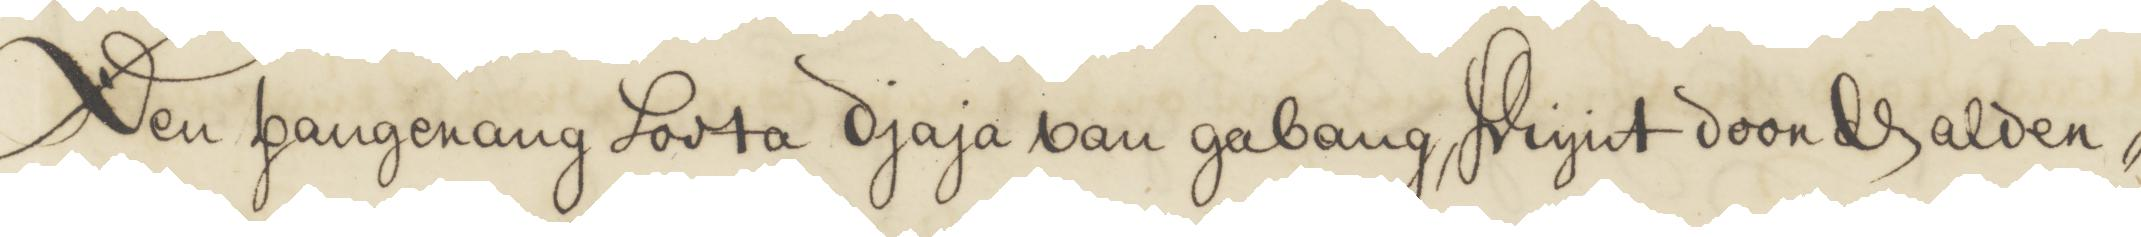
Den pangerang soeta djaja van gabang, schijnt door den alder„
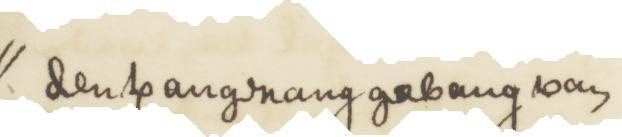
den pangerang gabang van
